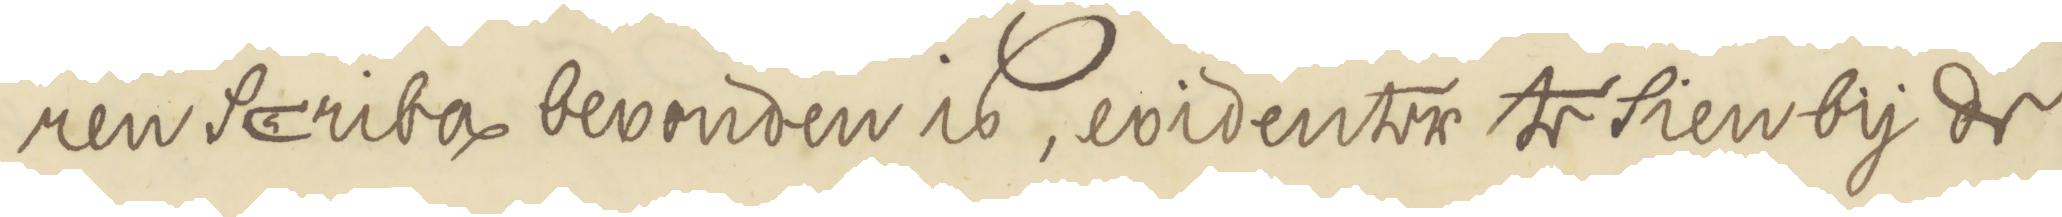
ren scriba bevonden is, evidenter te sien bij de
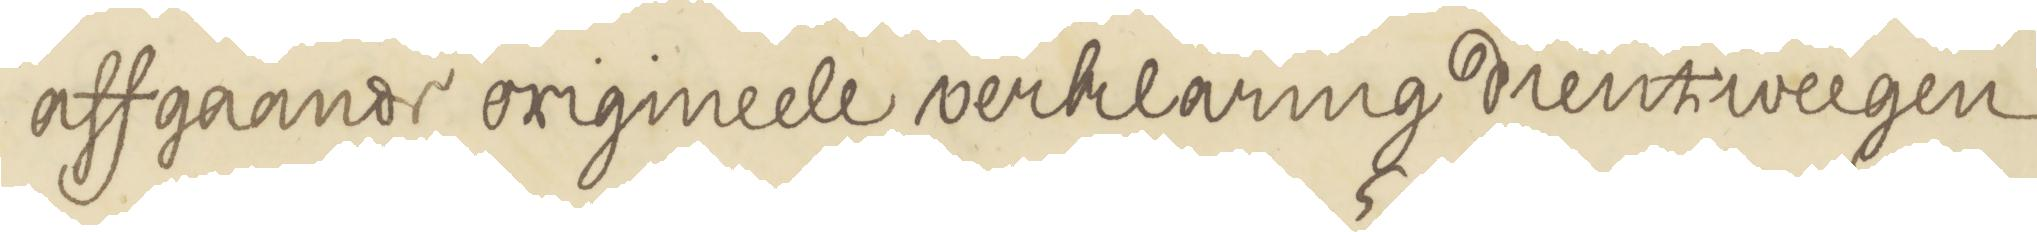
affgaande origineele verklaring dientweegen
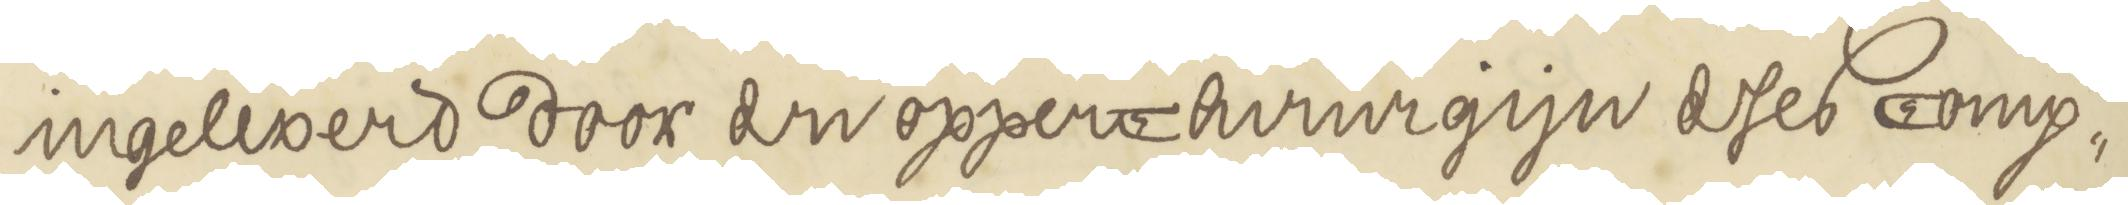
ingeleverd door den opperchirurgijn deses comp„
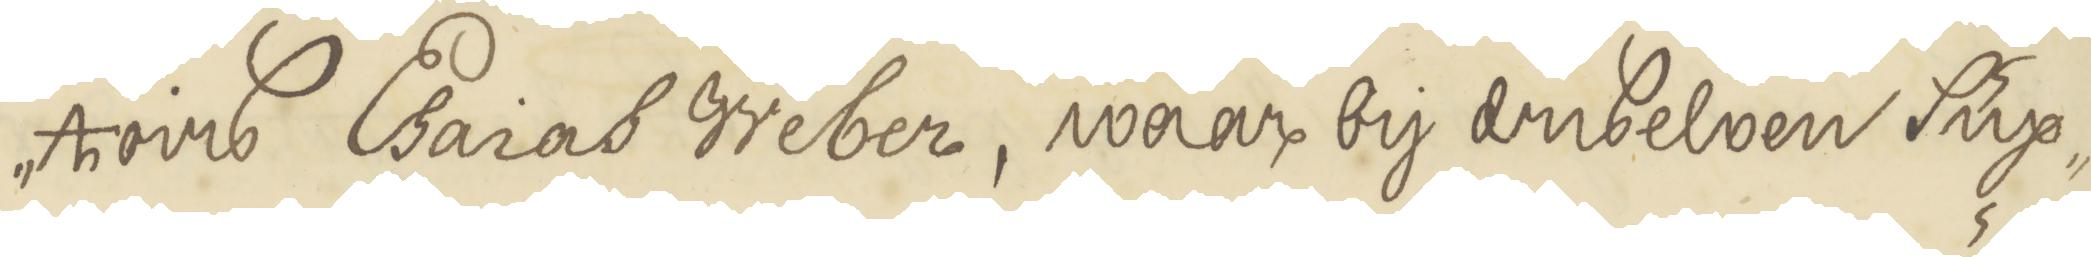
„toirs Ehaias Weber, waar bij denselven sup
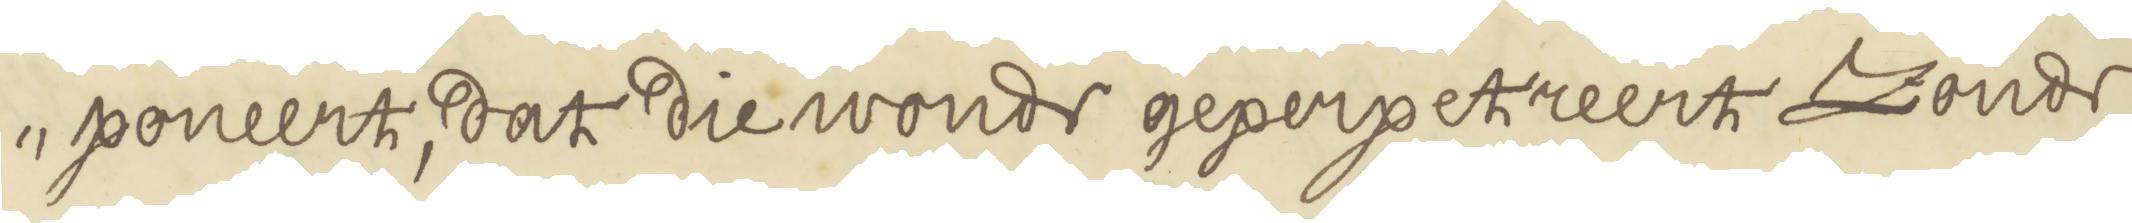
„poneert, dat die wonde geperpetreert zoude
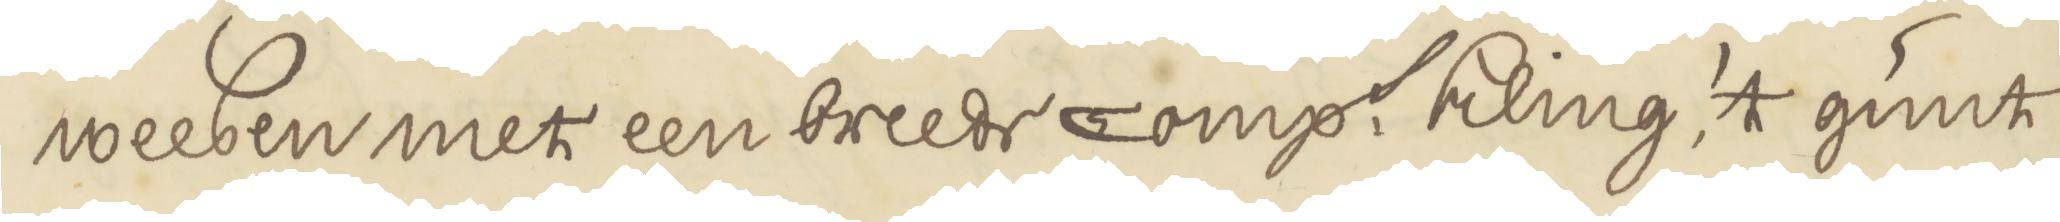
weesen met een breede comp:s kling, ’t gunt
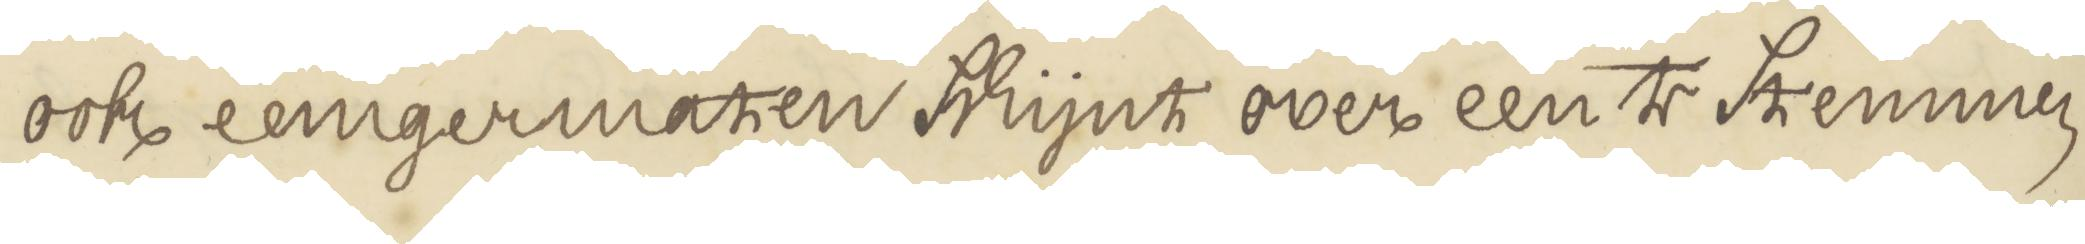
ook eenigermaten schijnt over een te stemmen
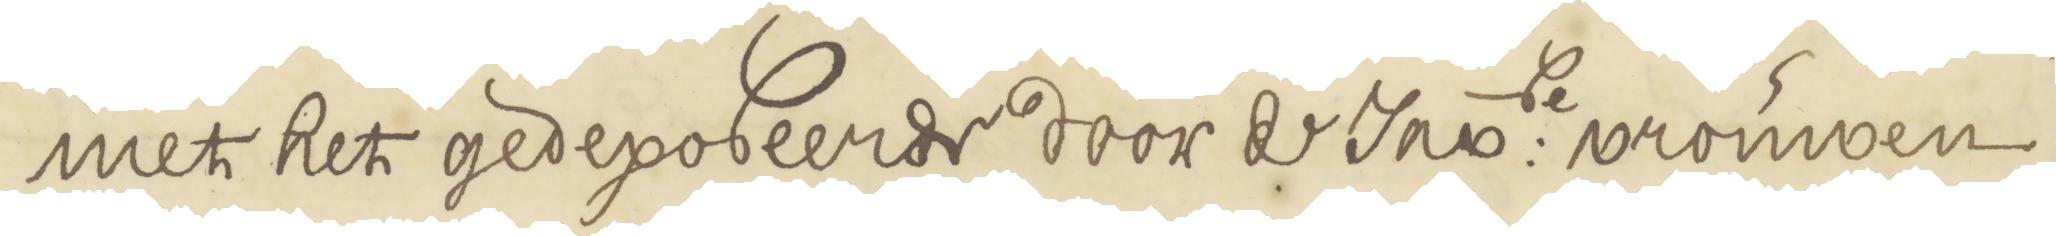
met het gedeposeerde door de Jav:se vrouwen
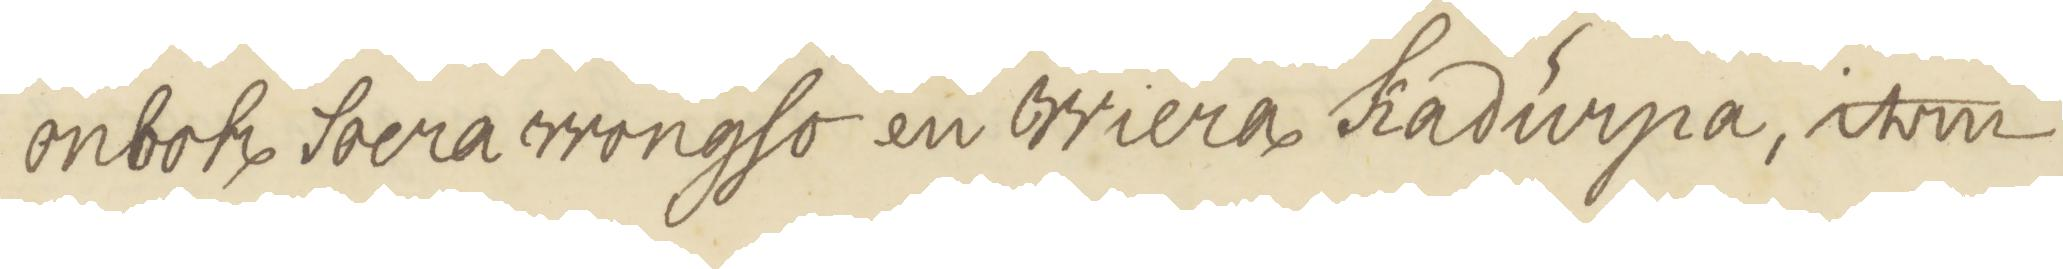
onbok soera wongso en wiera kadurpa, item
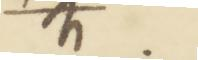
't.
